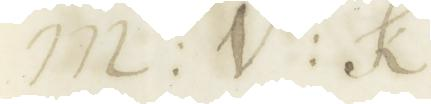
m: v: k
